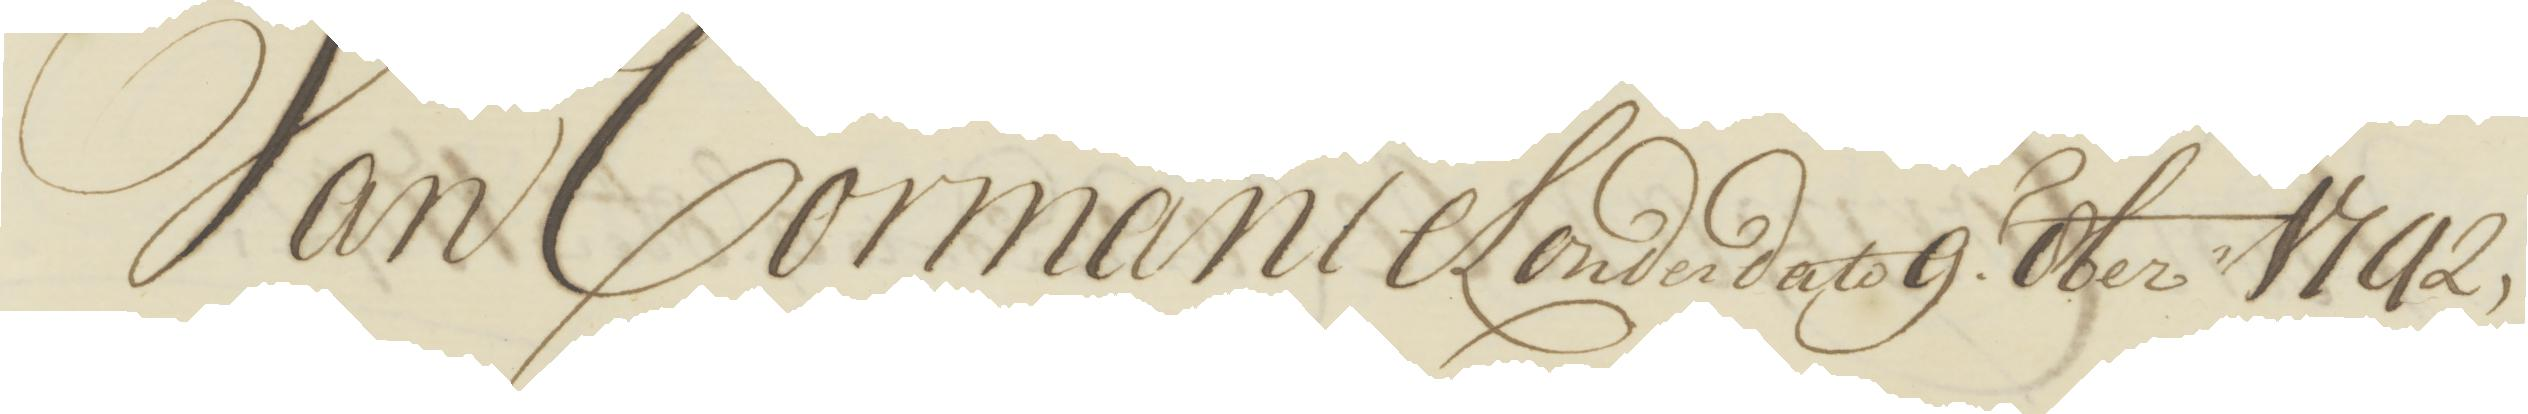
Van Cormandel onder dato 9.' 8ber 1742,
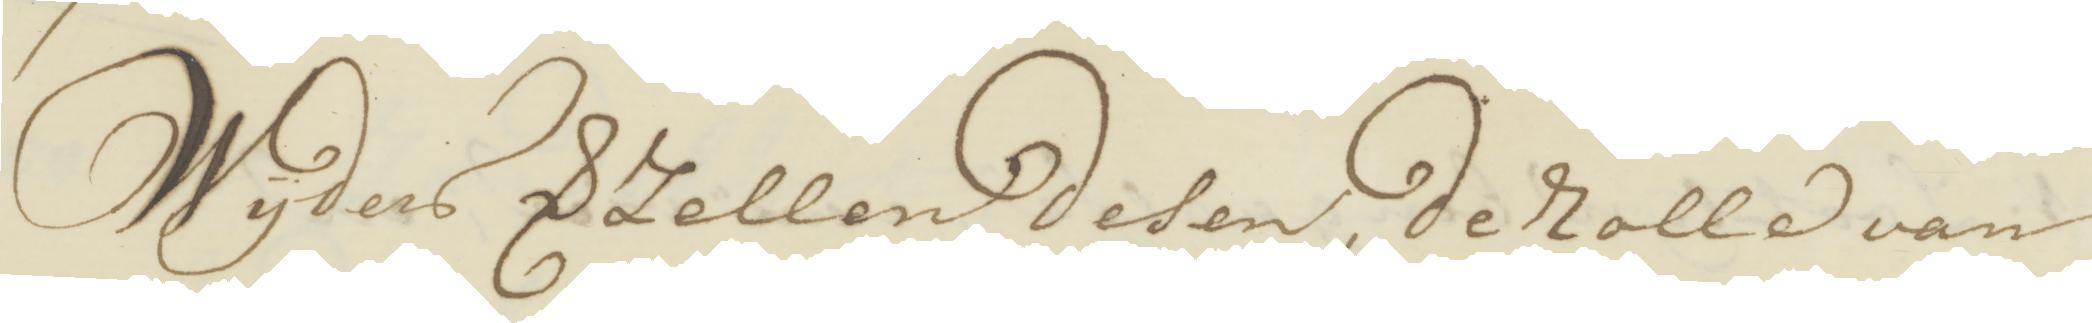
Wijders verzellen desen, de rolle van
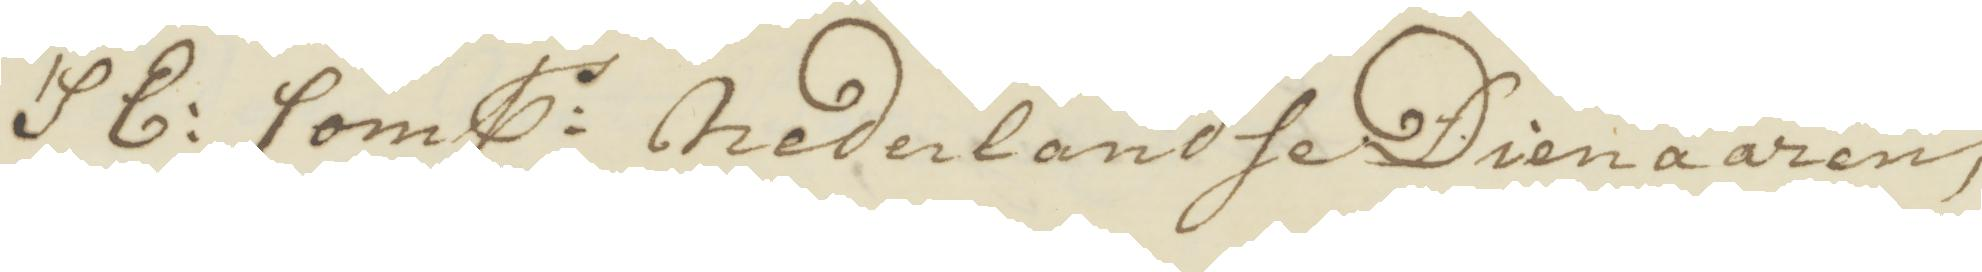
's E: Comp:s nederlandse Dienaaren,
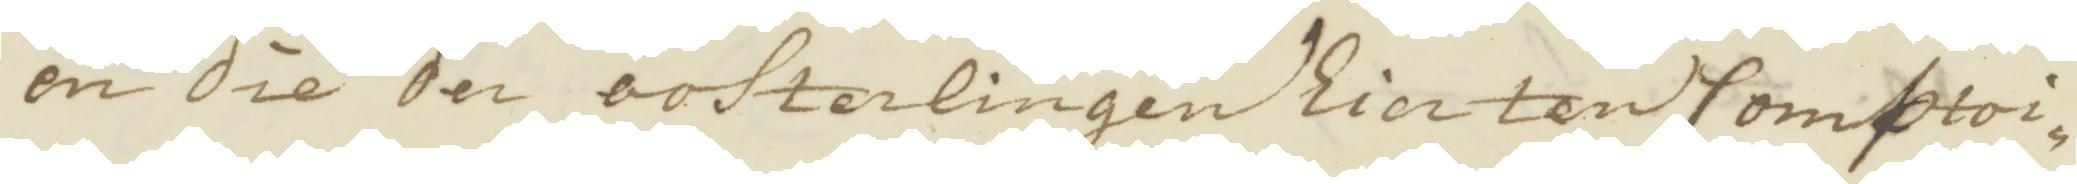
en die der oosterlingen hier ten Comptoi„
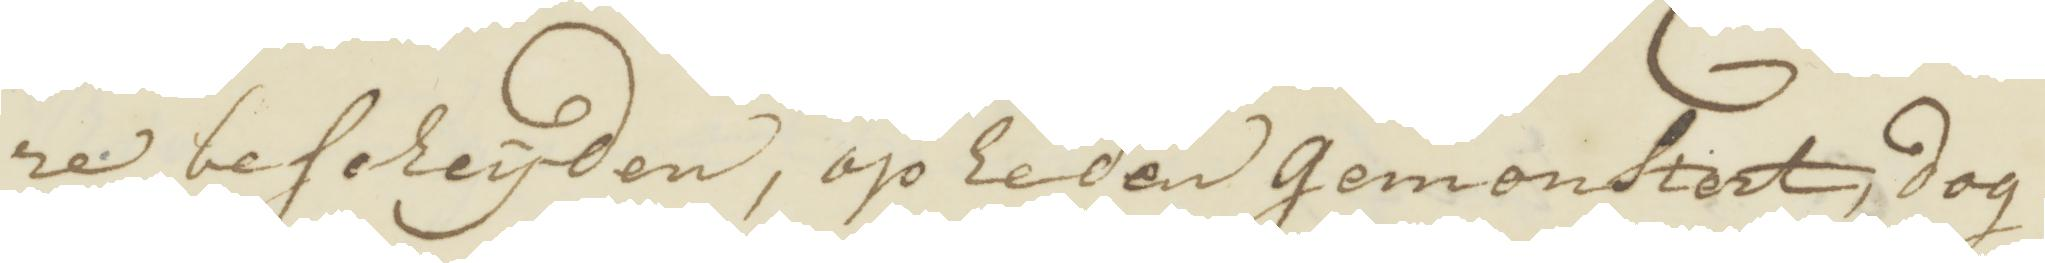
re bescheijden, op heden gemonstert, dog
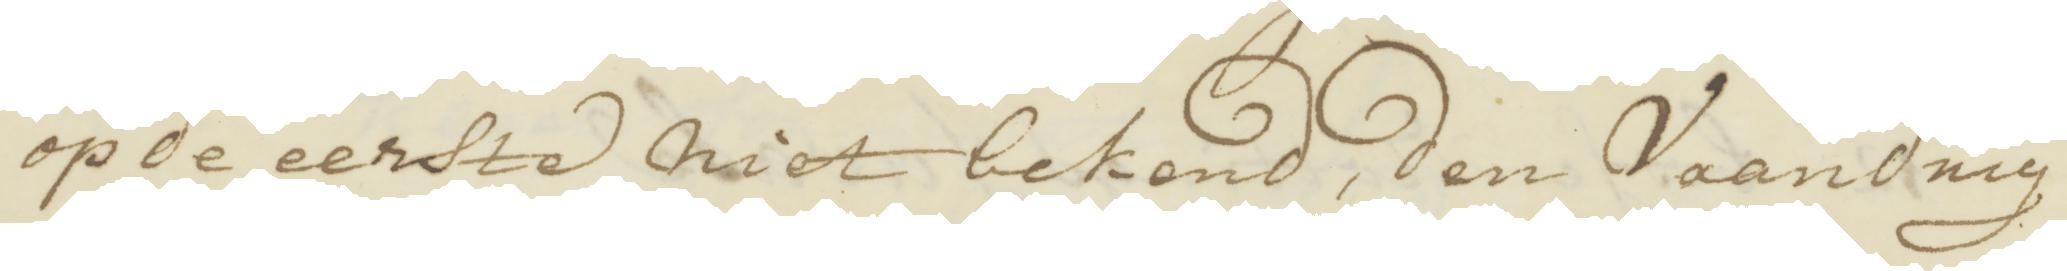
op de eerste niet bekend, den Vaandrig
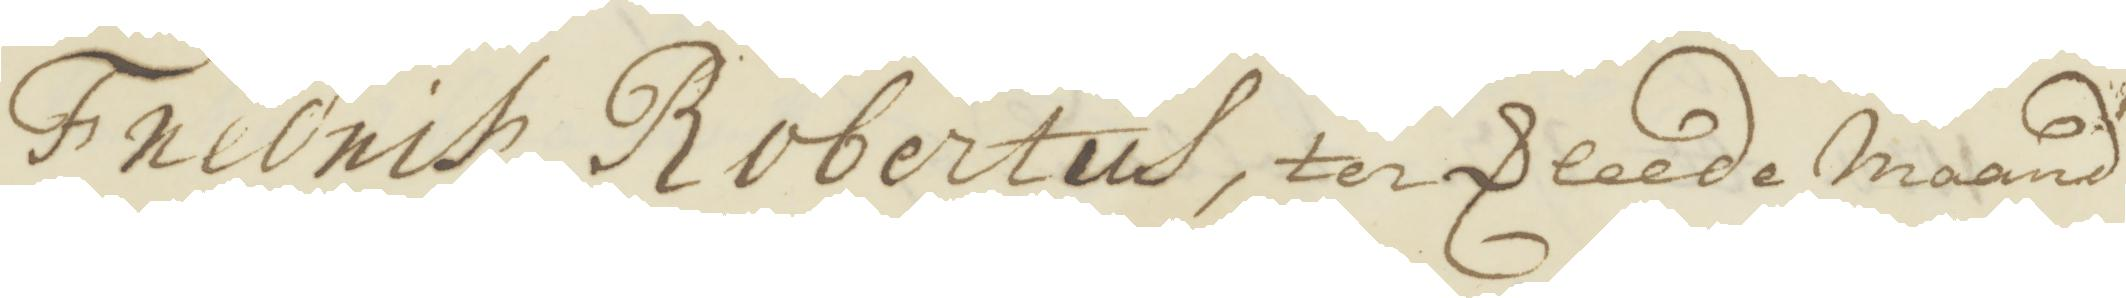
Fredrik Robertus, ter verleede maand
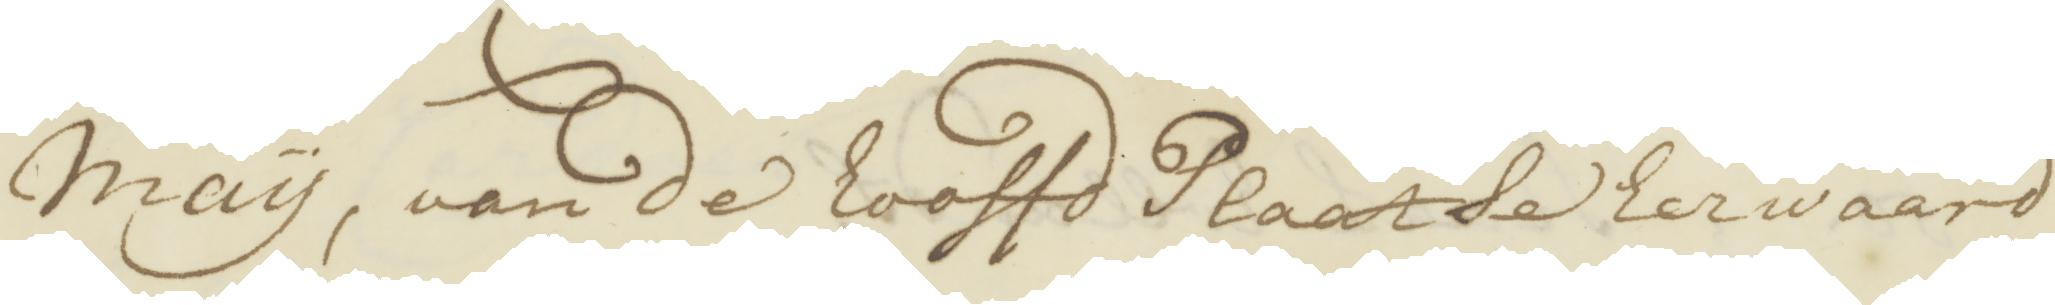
maij, van de hooffd Plaatse herwaard
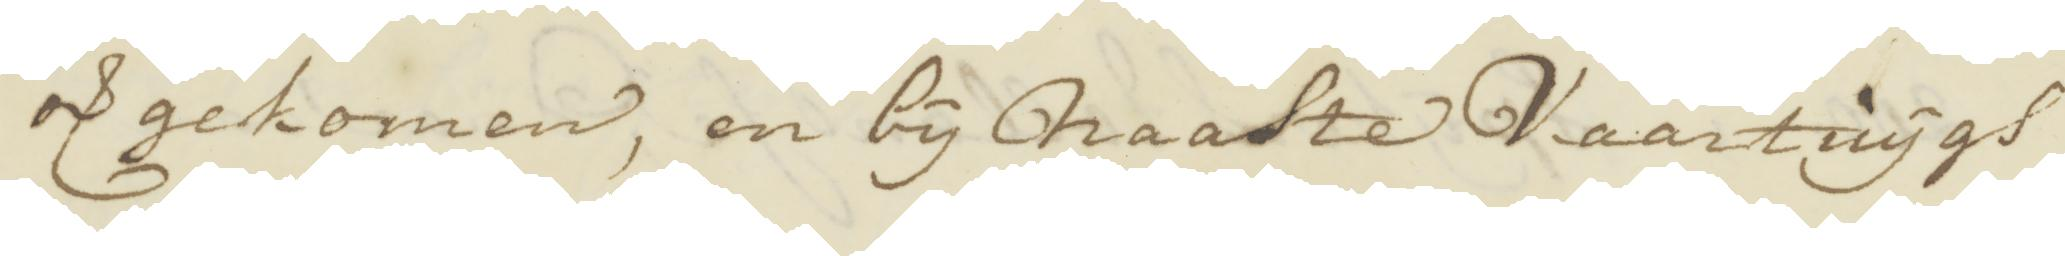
overgekomen, en bij naaste vaartuijgs
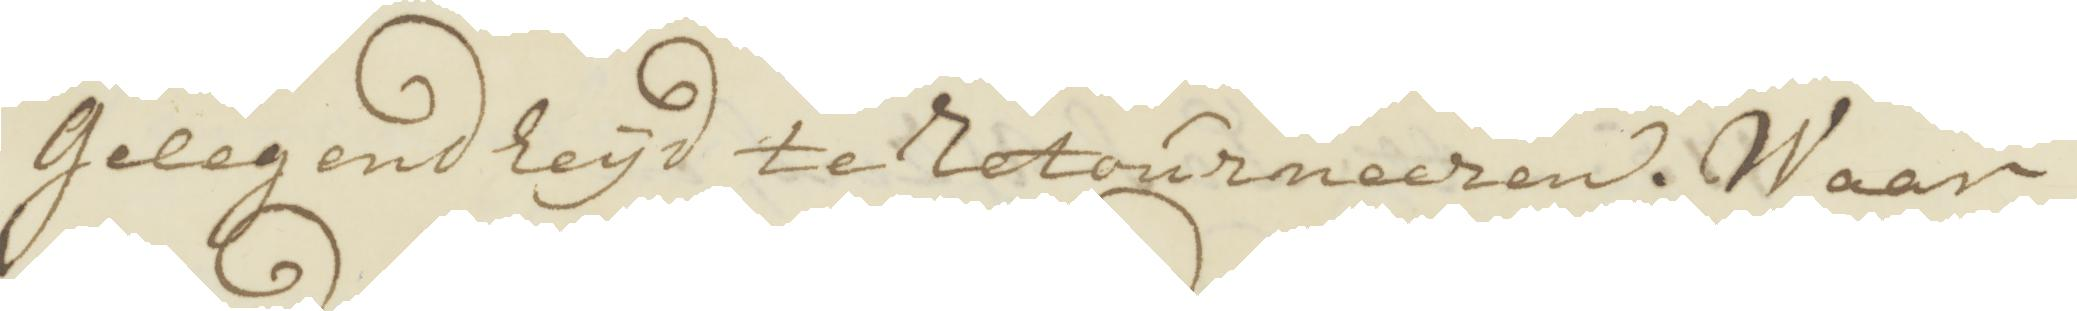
gelegendheijd te retourneeren. Waar
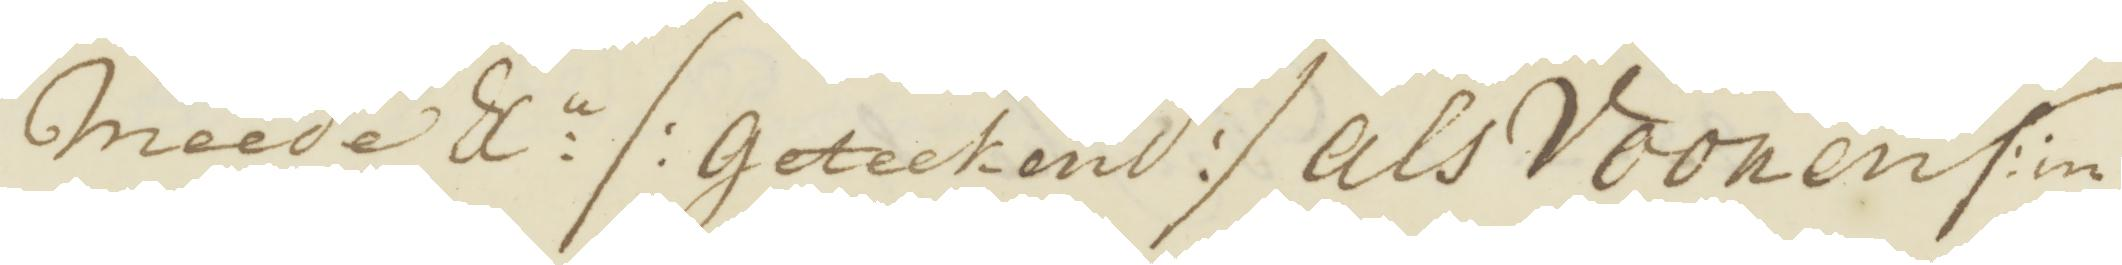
meede &:a /:geteekend:/ als Vooren /:in
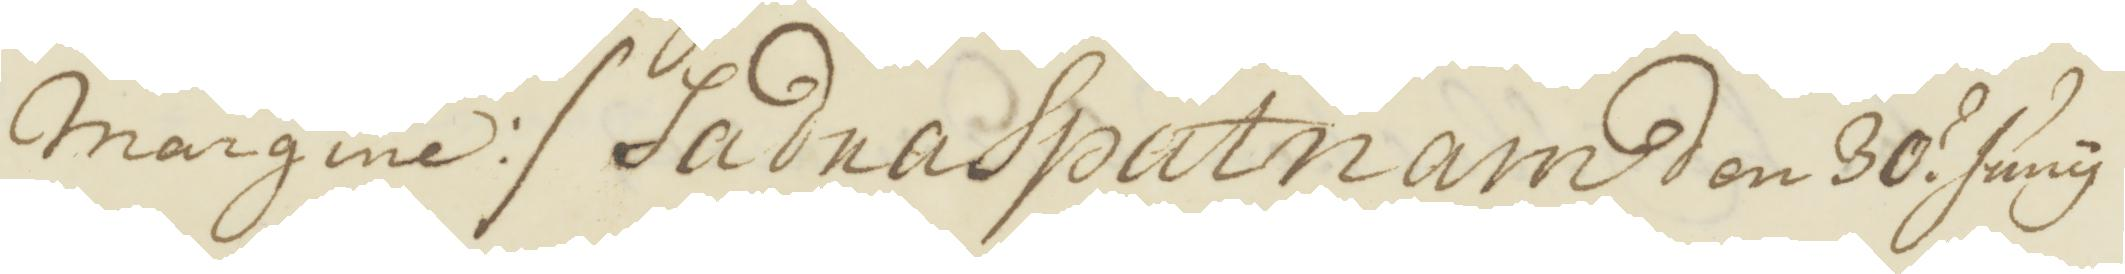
margine:/ sadraspatnam den 30.' Junij
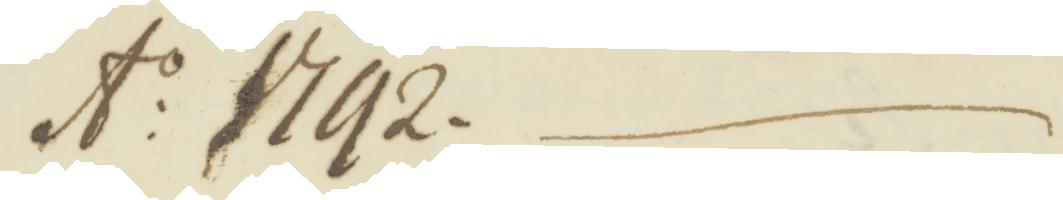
A:o 1742. —
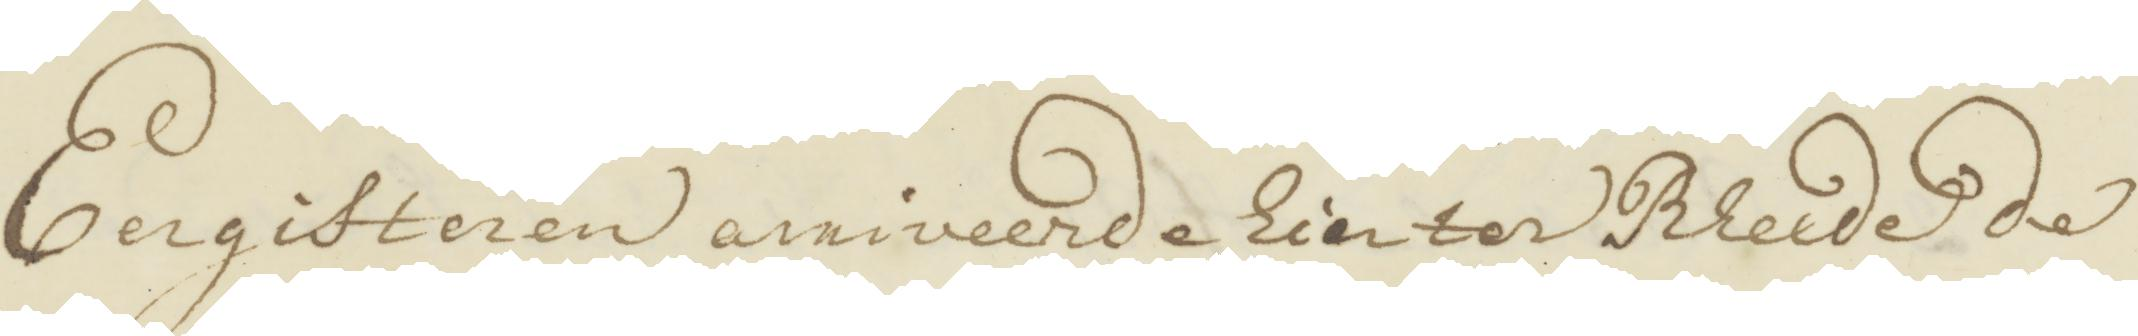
Eergisteren arriveerde hier ter Rheede de
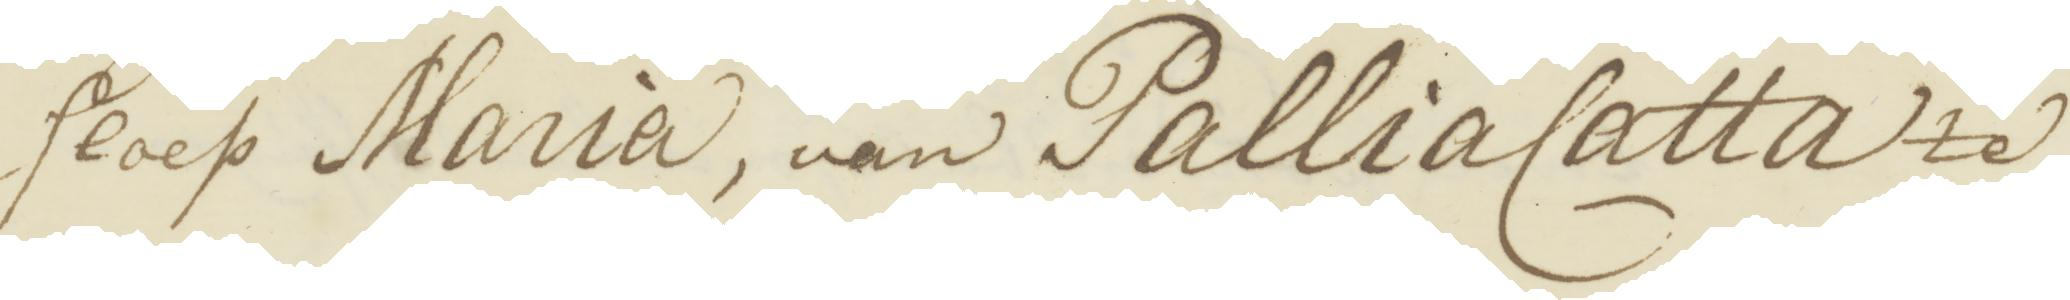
sloep Maria, van Palliacatta te
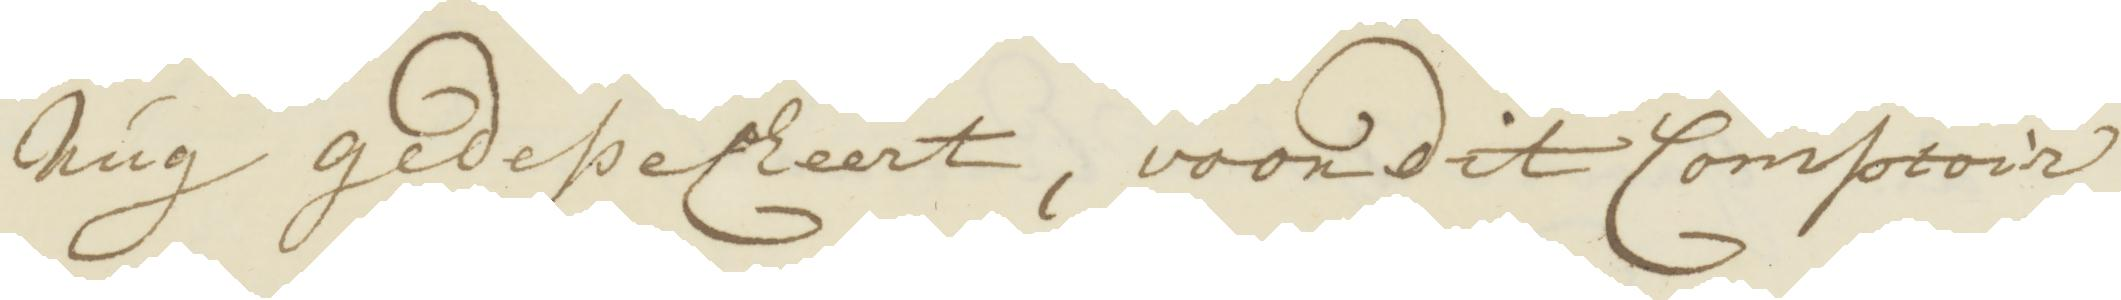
rug gedepecheert, voor dit Comptoir
